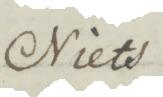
Niets
